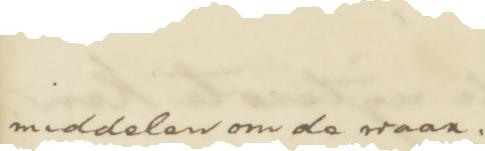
middelen om de waar„
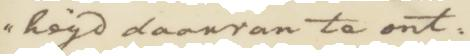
„heijd daarvan te ont„
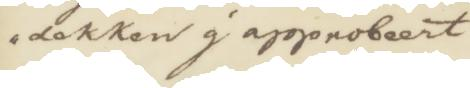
„dekken g’approbeert
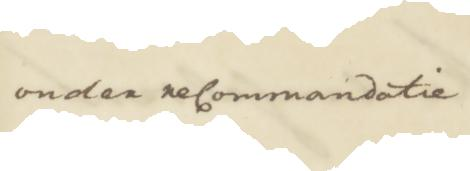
onder recommandatie
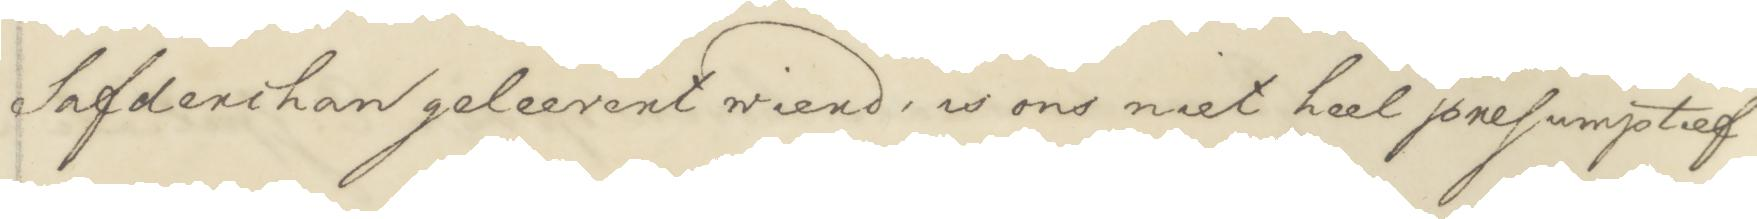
Safderchan geleevert wierd, is ons niet heel presumptief
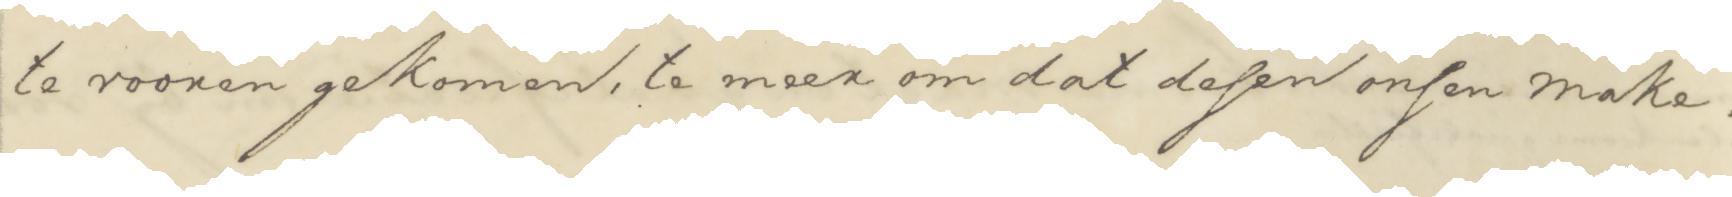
te vooren gekomen, te meer om dat desen onsen make„
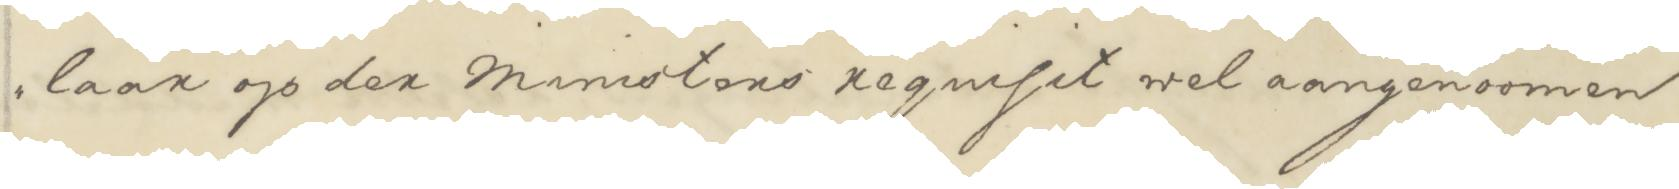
„laar op der ministers requisit wel aangenoomen
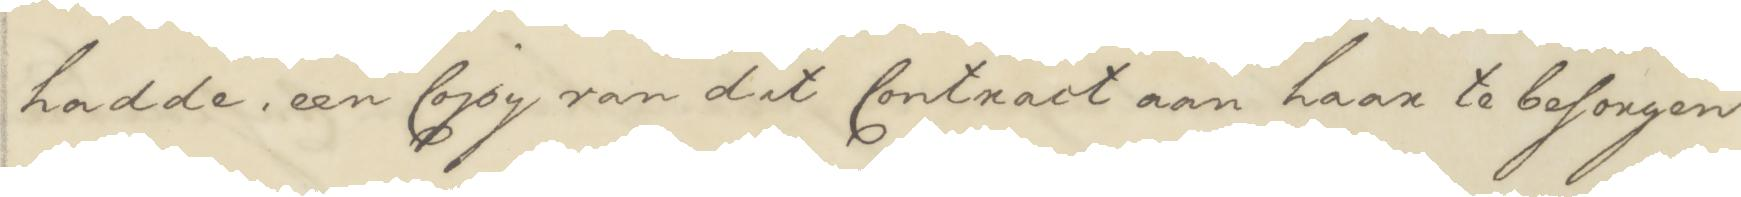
hadde, een Copij van dit Contract aan haar te besorgen
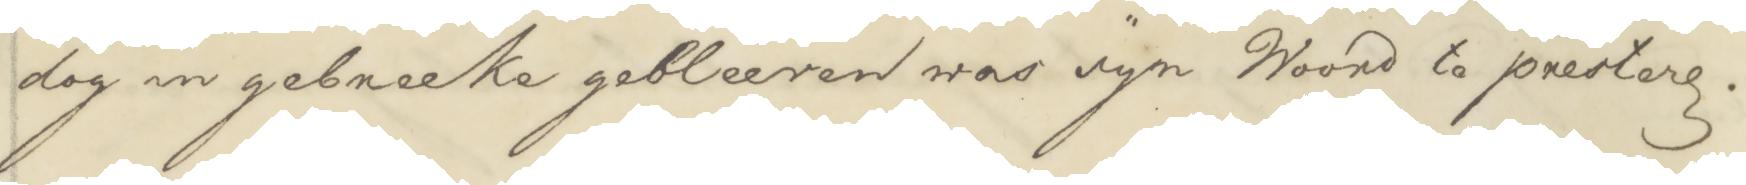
dog in gebreeke gebleeven was sijn Woord te presteren.
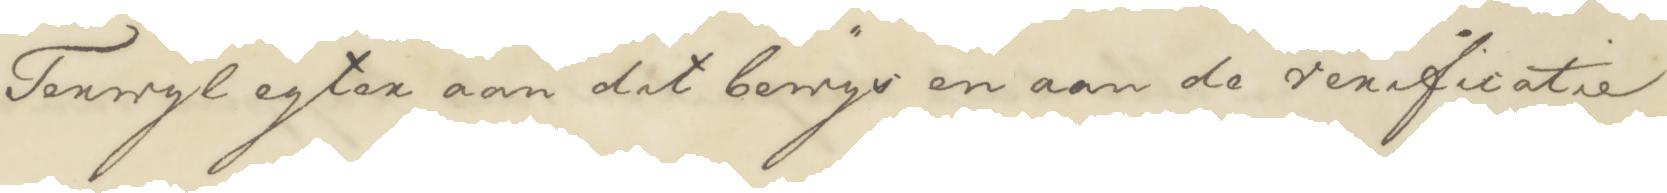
Terwyl egter aan dit bewijs en aan de verificatie
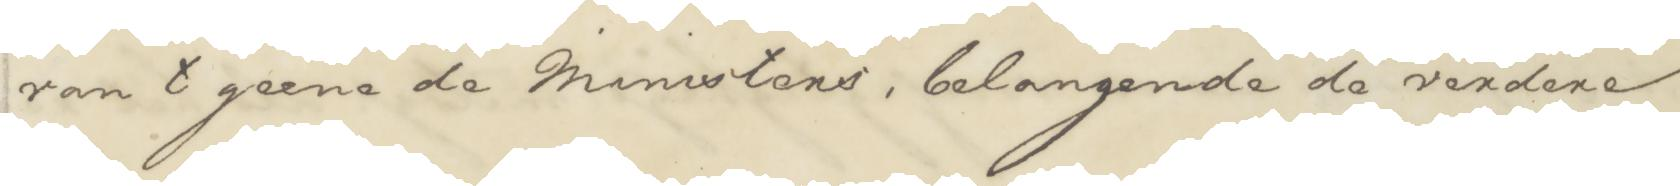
van t geene de Ministers, belangende de verdere
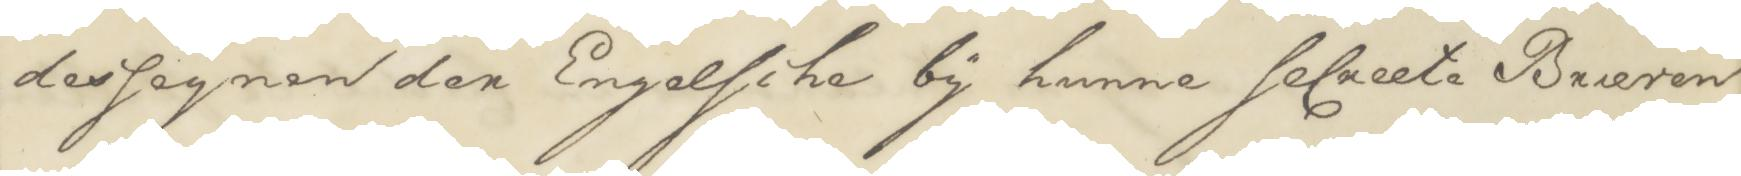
desseynen der Engelsche bij hunne secreete Brieven
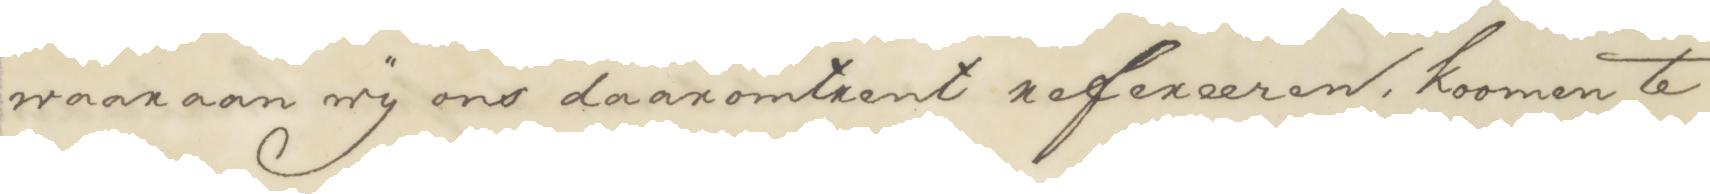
waar aan wij ons daar omtrent refereeren, koomen te
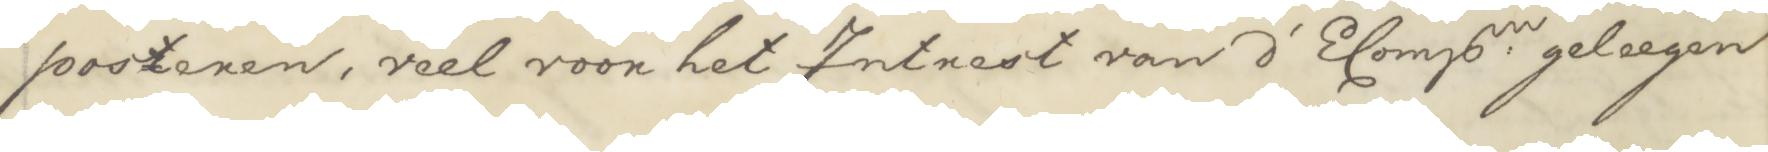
posteren, veel voor het Jntrest van d' EComp:n geleegen
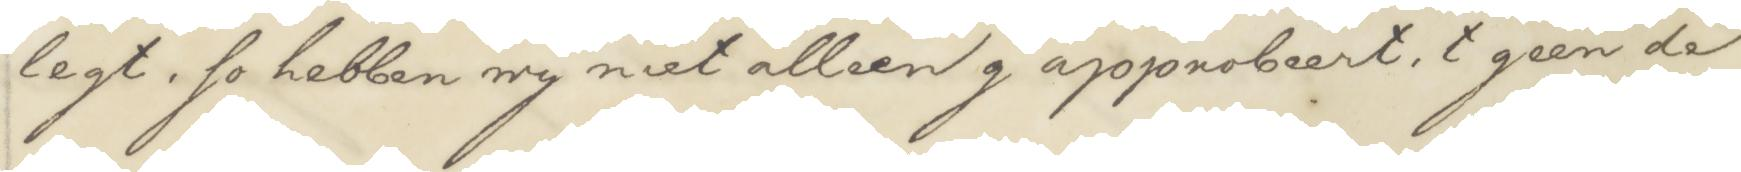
legt, so hebben wy niet alleen g’approbeert, ’t geen de
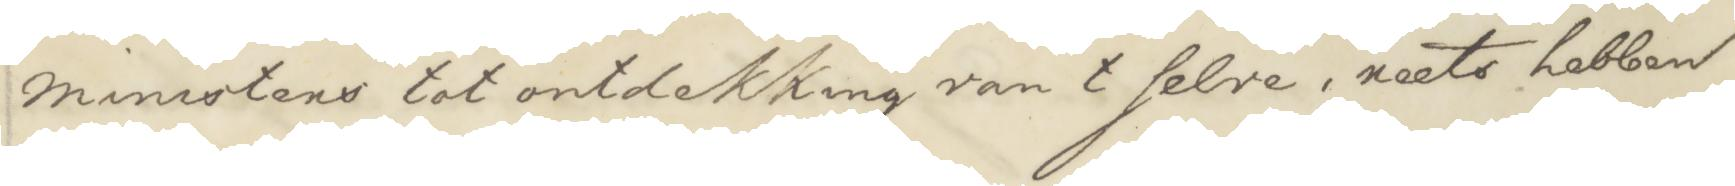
ministers tot ontdekking van ’t selve, reets hebben
